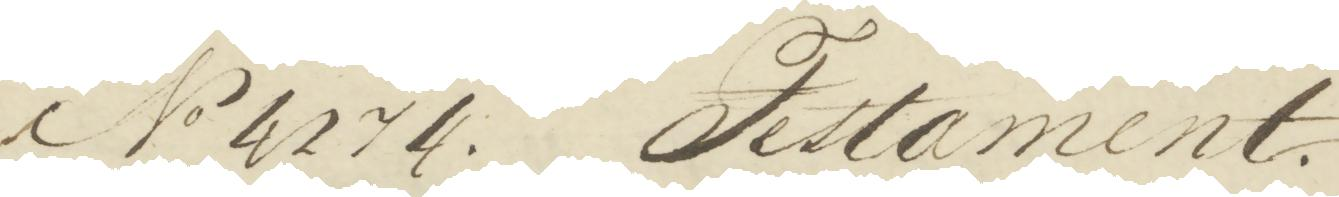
No 4274. Testament.
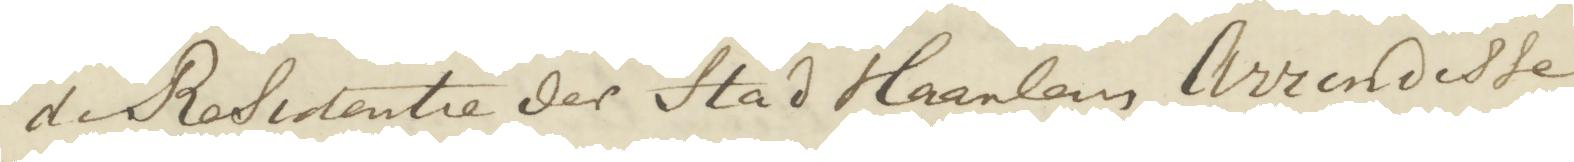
de Resistentie der Stad Haarlem, Arrondesse
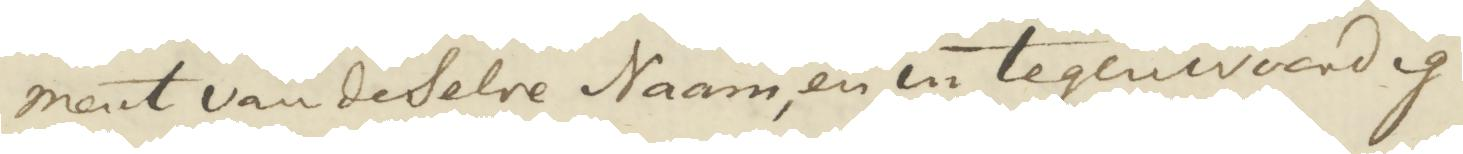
ment van deselve Naam, en in tegenwoordig
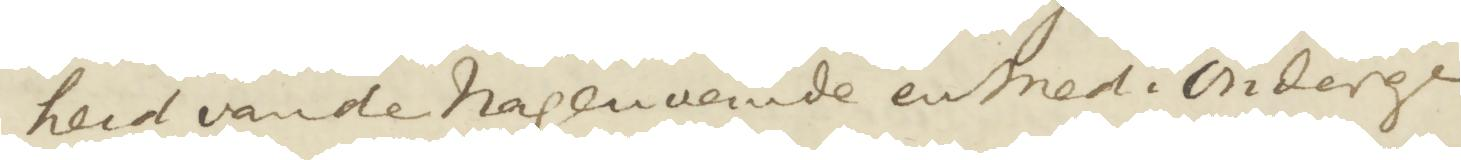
heid van de Nagenoemde en mede onderge
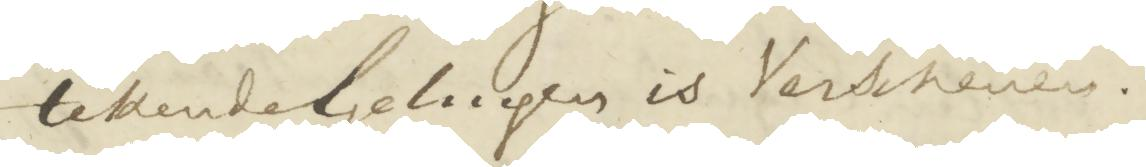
tekende Getuigen is Verschenen.
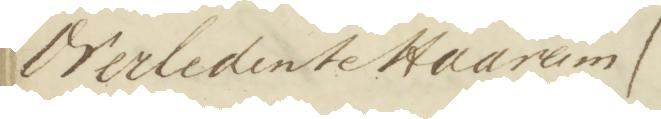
Overledente Haarlem
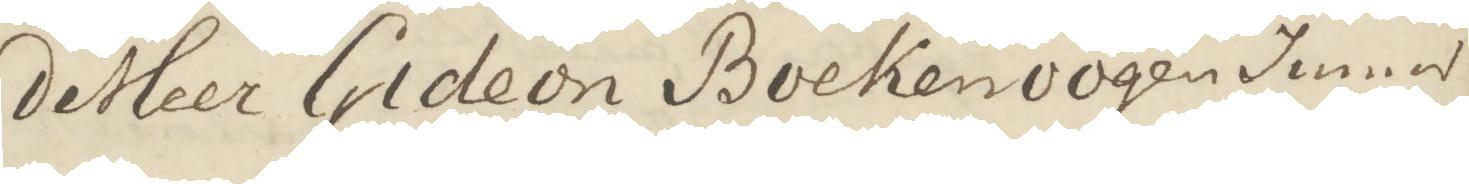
de Heer Gideon Boekenoogen Iunior
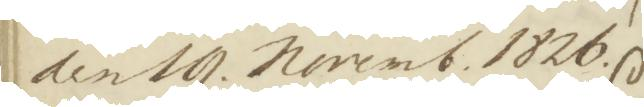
den 19. Novemb. 1826.
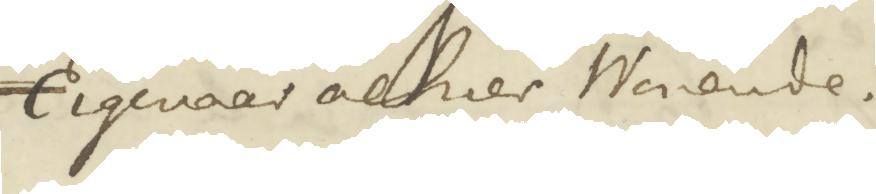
Eigenaar alhier Wonende,
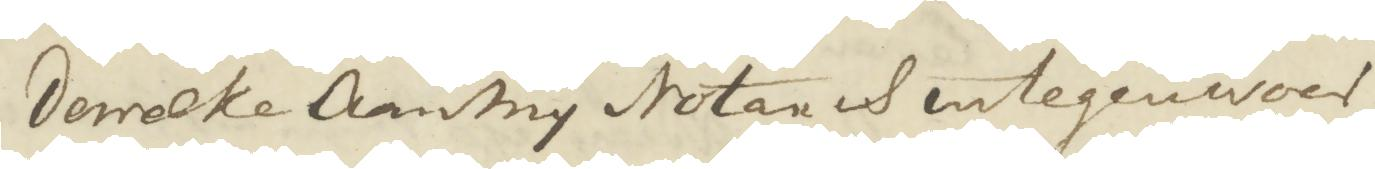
dewelke Aanmy Notaris integenwoor
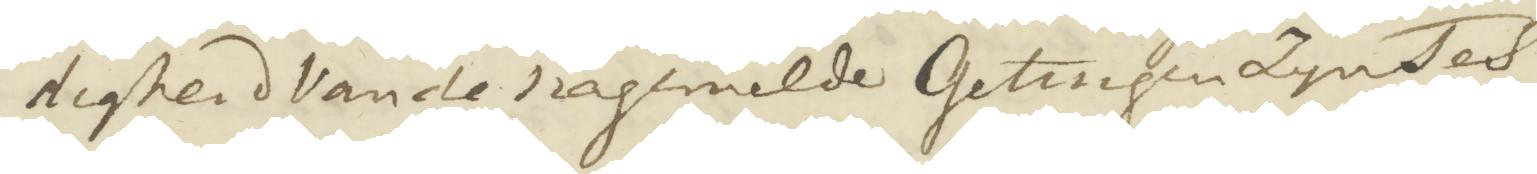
digheid van de nagemelde getuigen Zyn Tes
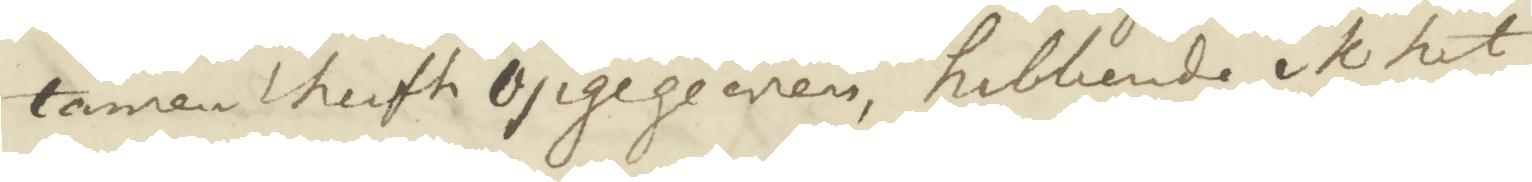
tamentheeft opgegeeven, hebbende ik het
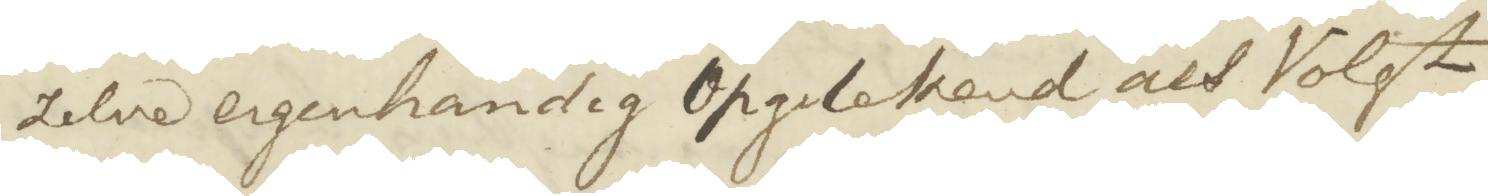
zelve eigenhandig opgetekend als Volgt
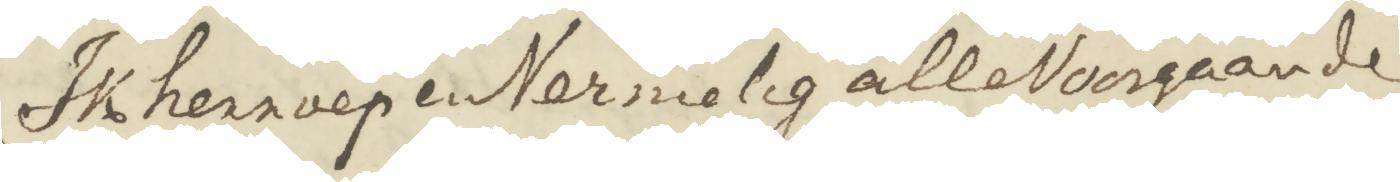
Ik herroep en Vernietig alleVoorgaande
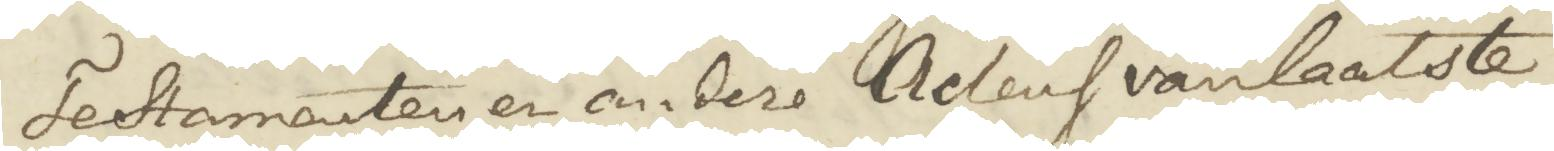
Testamenten, en andere Actens vanlaatste
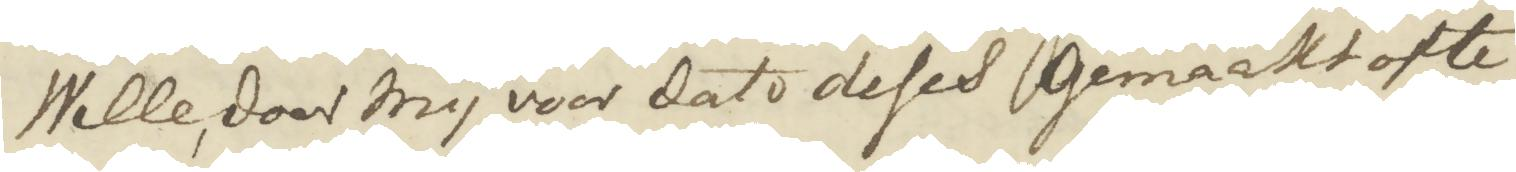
Wille, door mij voor dato deses gemaakt ofte
